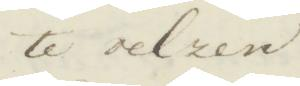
te velzen
